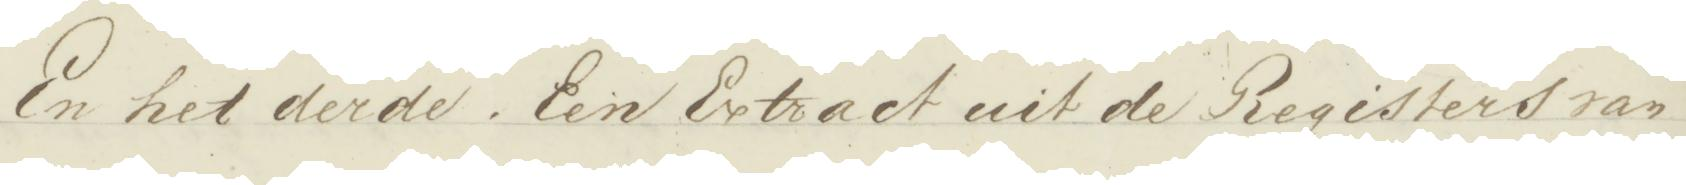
En het derde. Een Extract uit de Registers van
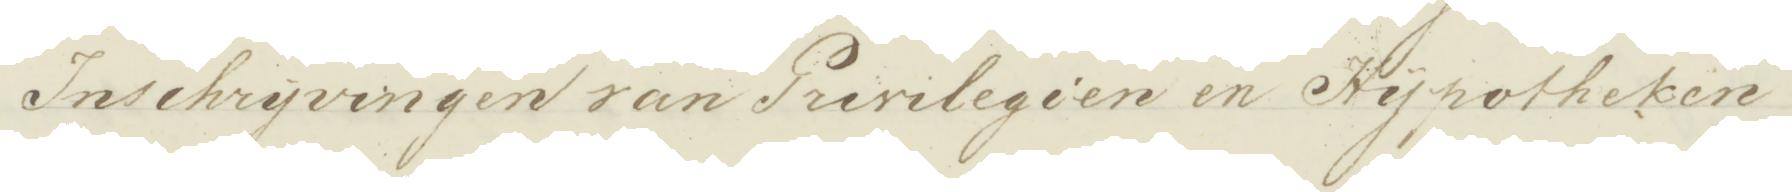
Inschrijvingen van Privilegien en Hijpotheken
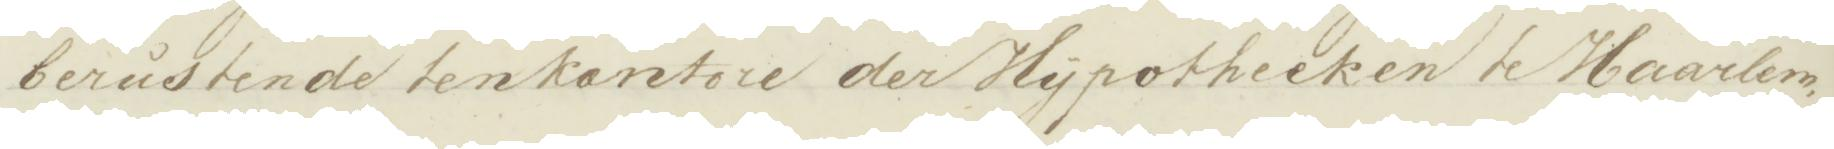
berustende ten kantore der Hijpotheeken te Haarlem
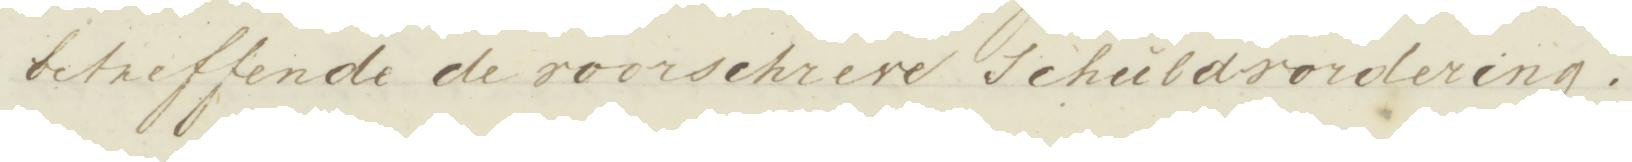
betreffende de voorschreve schuldvordering.
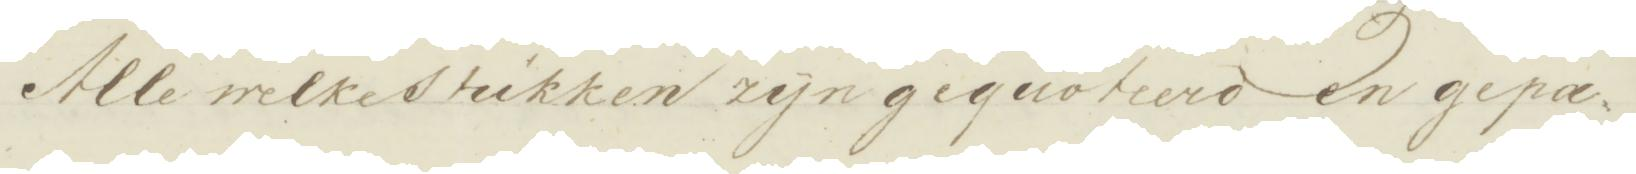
Alle welke stukken zijn gequoteerd en gepa„
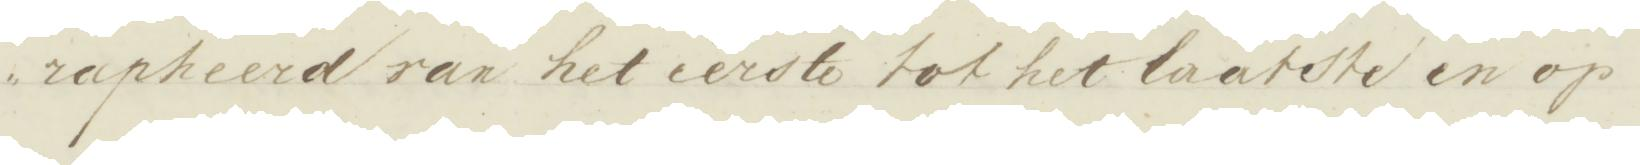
„rapheerd van het eerste tot het laatste en op
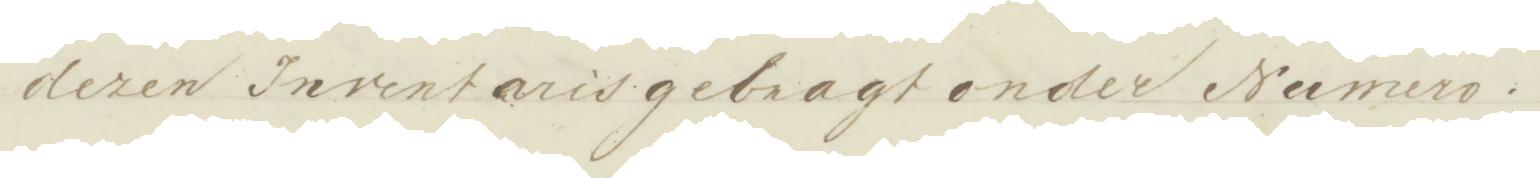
dezen Inventaris gebragt onder Numero.
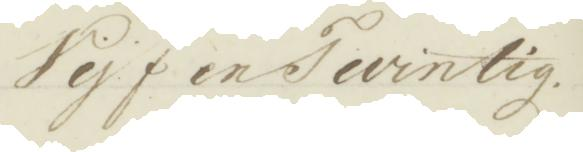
Vijf en Twintig.
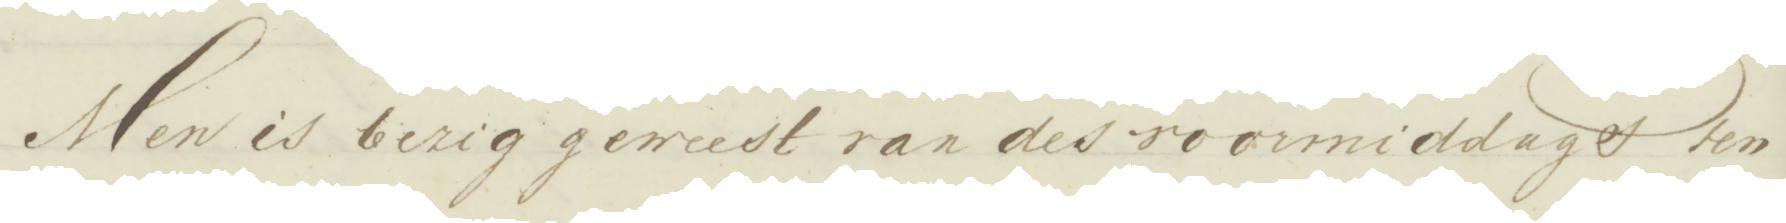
Men is bezig geweest van des voormiddags ten
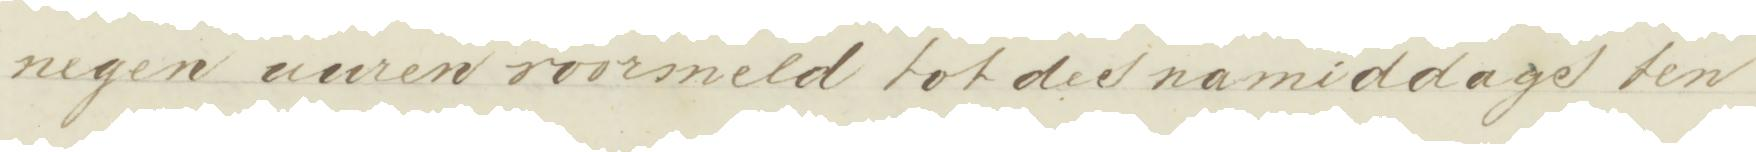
negen uuren voormeld tot des namiddags ten
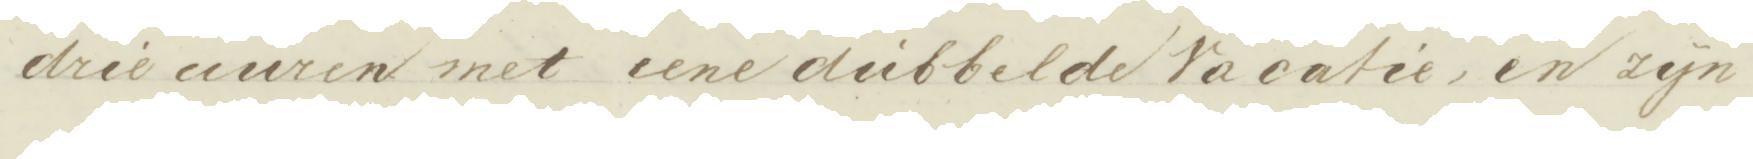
drie uuren met eene dubbelde vacatie, en zijn
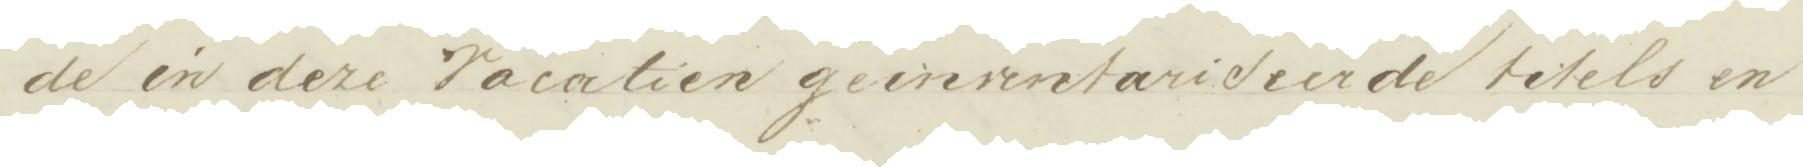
de in deze Vacatien geinventariseerde titels en
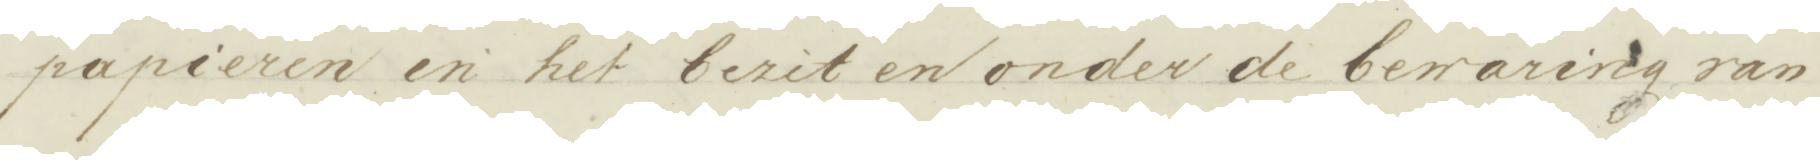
papieren in het bezit en onder de bewaring van
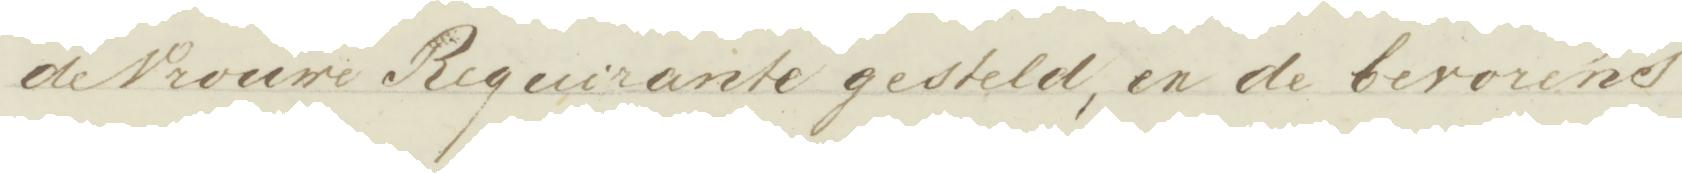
de Vrouwe Requirante gesteld, en de bevorens
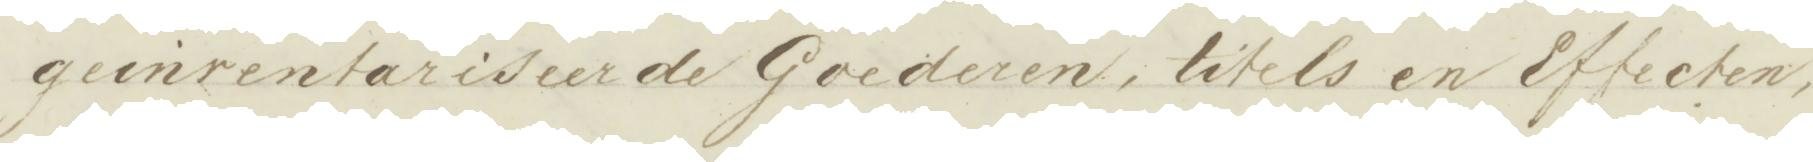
geinventariseerde Goederen, titels en Effecten,
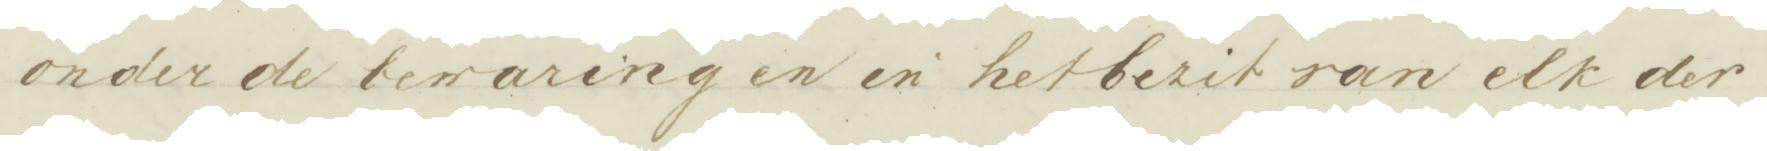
onder de bewaring en in het bezit van elk der
